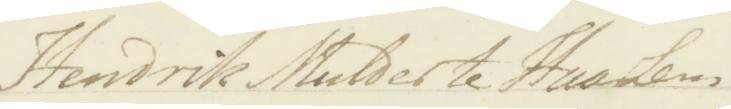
Hendrik Mulder te Haarlem
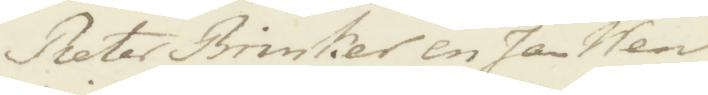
Pieter Brinker en Jan Wen
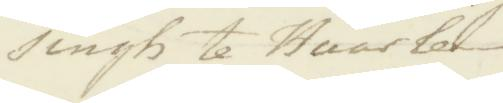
singh te Haarlem
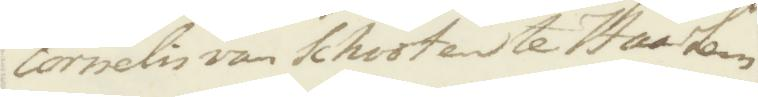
cornelis van Schooten te Haarlem
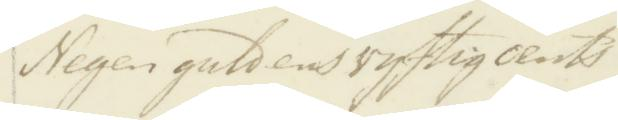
Negen guldens vyftig cents
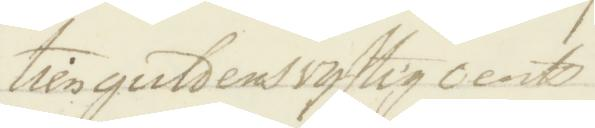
tien guldens vyftig cents
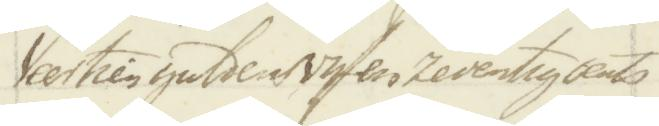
Veertien guldens vyf en zeventig cents
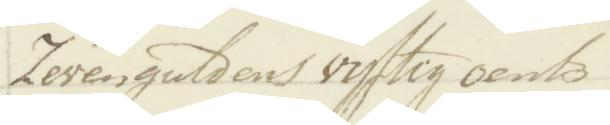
Zeven guldens vyftig cents
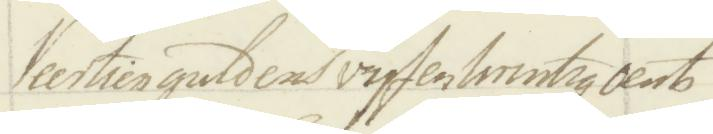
Veertien guldens vyfen twintig cents
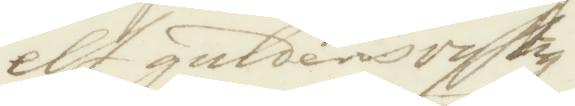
elf guldens vyftig
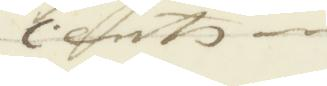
cents—
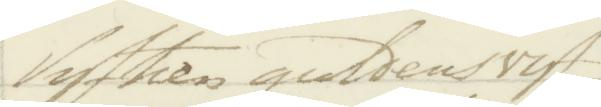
Vyftien guldens vyf
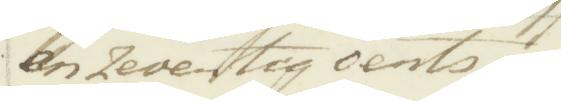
en zeventig cents -
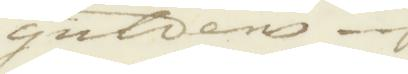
gulden —
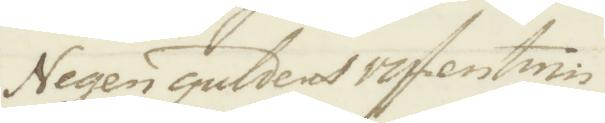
Negen guldens vyf en twin
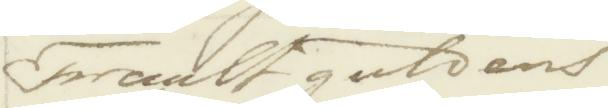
Twaalf guldens
